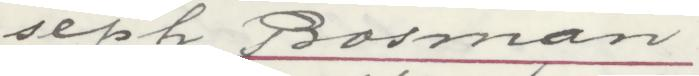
seph Bosman
